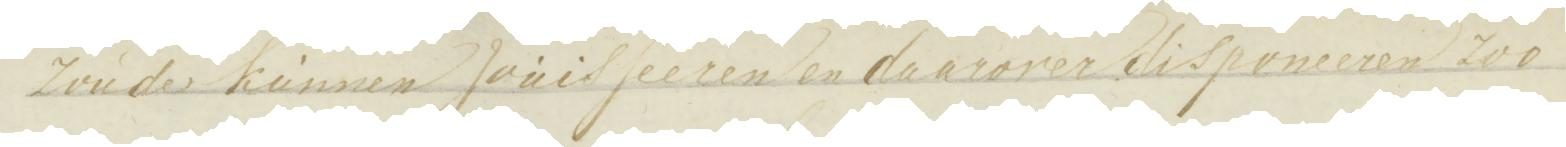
zoude kunnen Jouisseeren en daarover disponeeren zoo
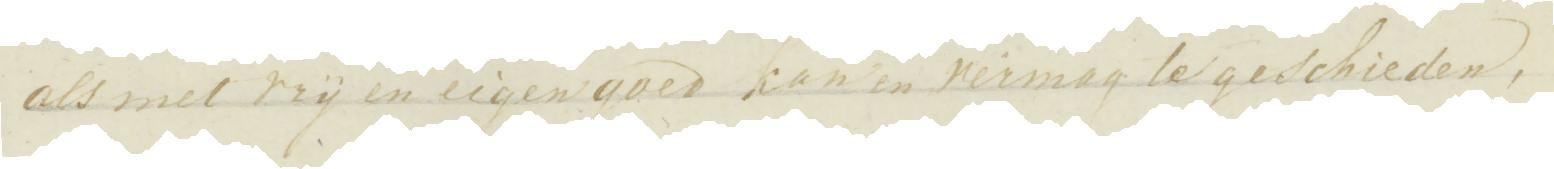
als met vrij en eigen goed kan en vermag te geschieden,
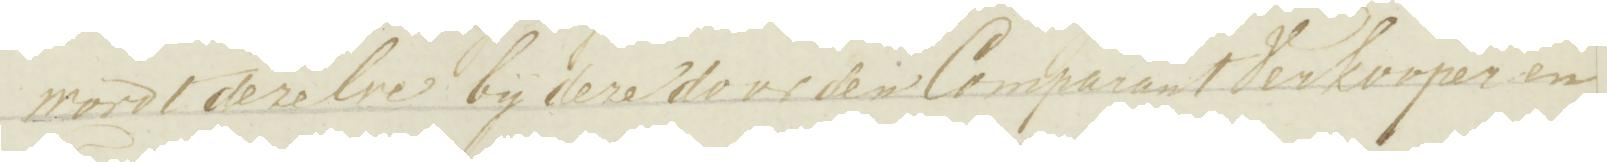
wordt dezelve bij deze door den Comparant Verkooper en
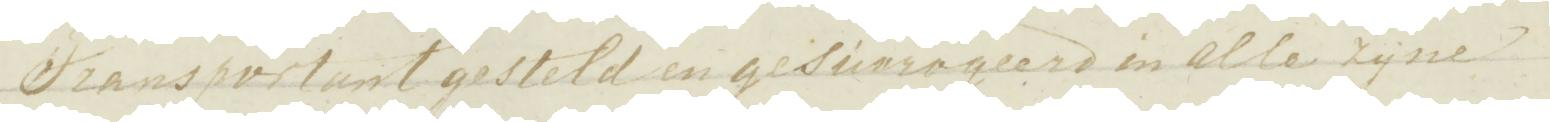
Transportant gesteld en gesurrogeerd in alle zijne
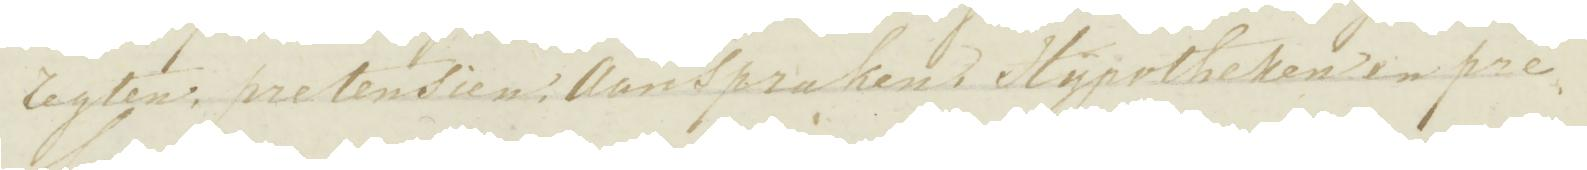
regten, pretensien, Aanspraken, Hijpotheken en pre„
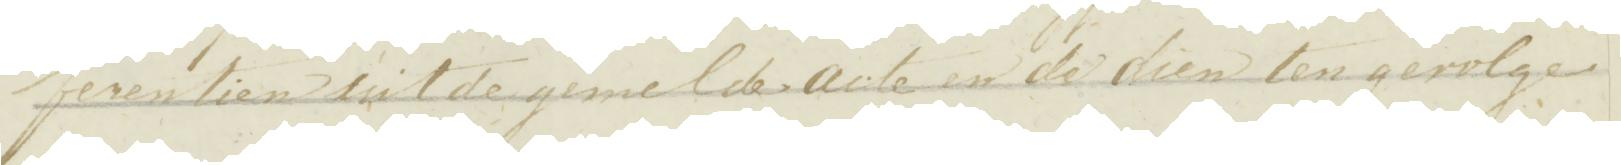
ferentien uit de gemelde acte en de dien ten gevolgen
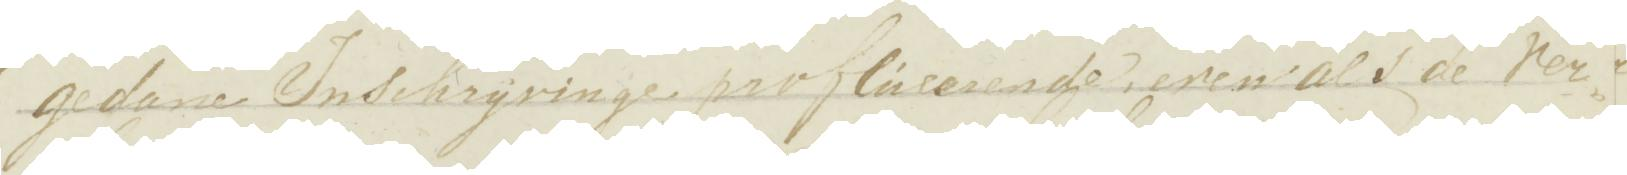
gedane Jnschrijvinge proflucerende, even als de ver„
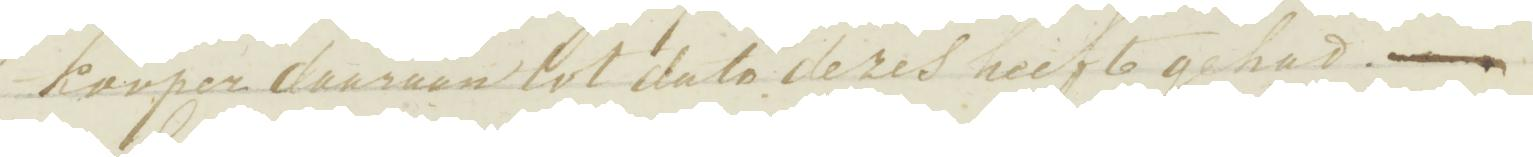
kooper daaraan tot dato dezes heeft gehad.
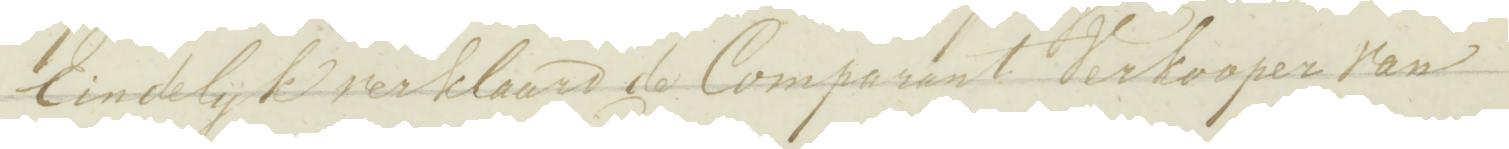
Eindelijk verklaard de Comparant Verkooper van
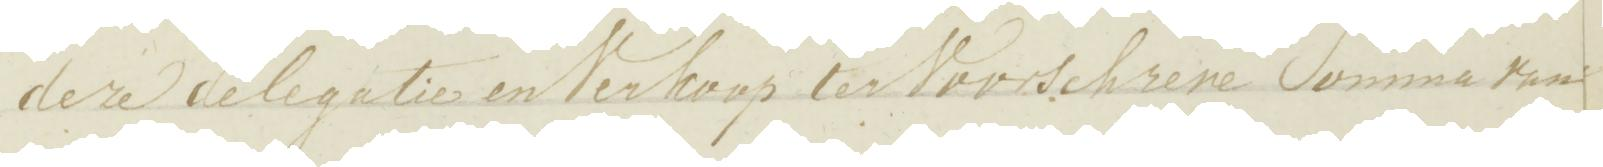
deze delegatie en Verkoop ter voorschreve Somma van
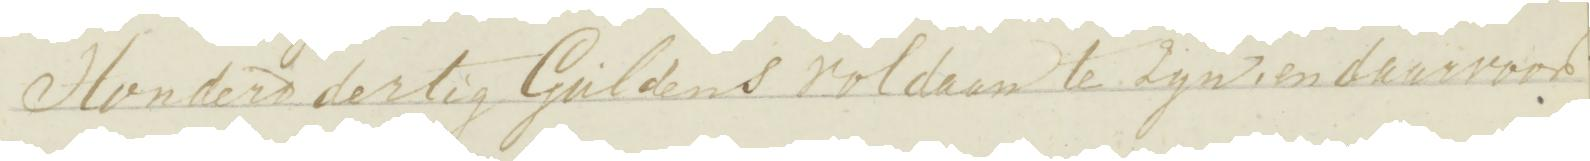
Honderd dertig Guldens voldaan te zijn, en daarvoor
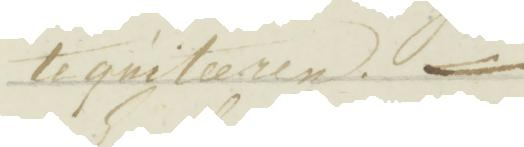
te quiteeren.
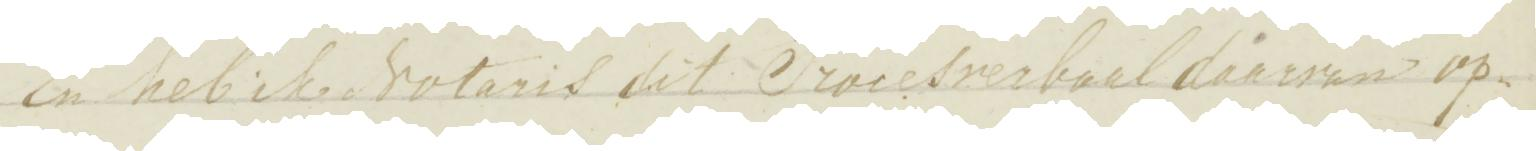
en heb ik Notaris dit Procesverbaal daarvan op„
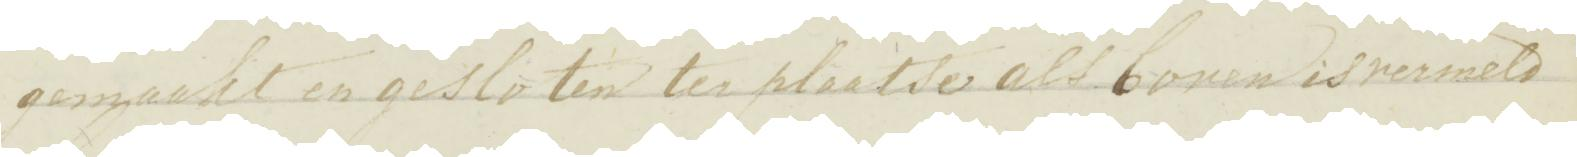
gemaakt en gesloten ter plaatse als boven is vermeld
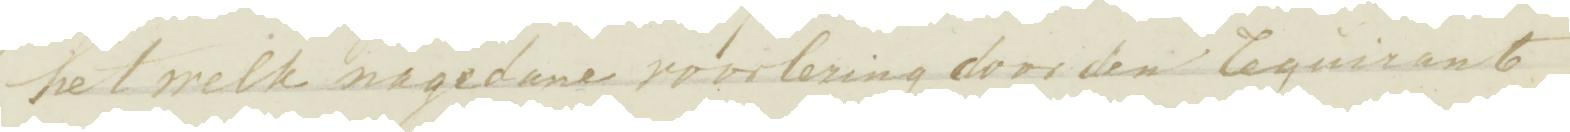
het welk nagedane voorlezing door den requirante
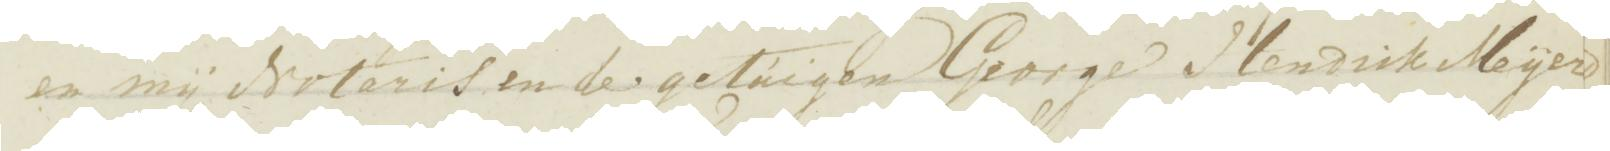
en mij Notaris en de getuigen George Hendrik Meijer
